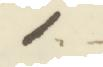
1. —
